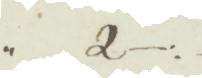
„ 2 —:
